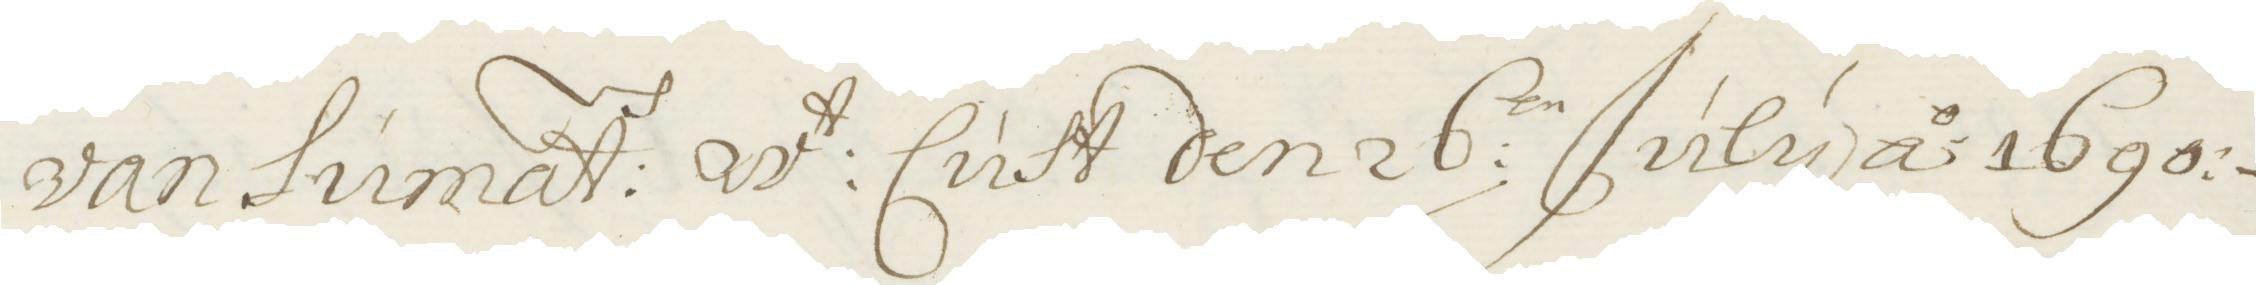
van Sumat:s W:t Cust den 26:en Julij a:o 1690:
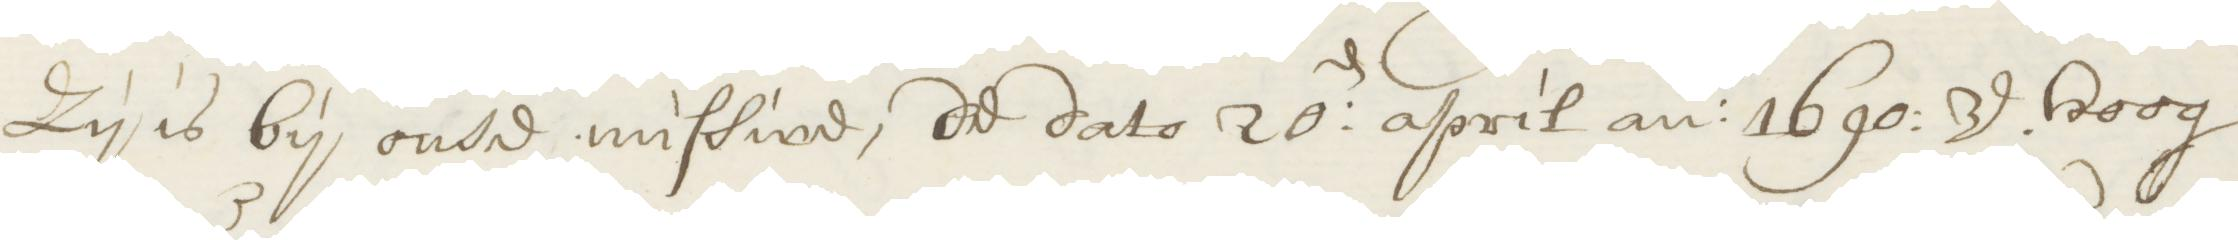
Zij is bij onse missive, de dato 28:en april an:o 1690: V. hoog
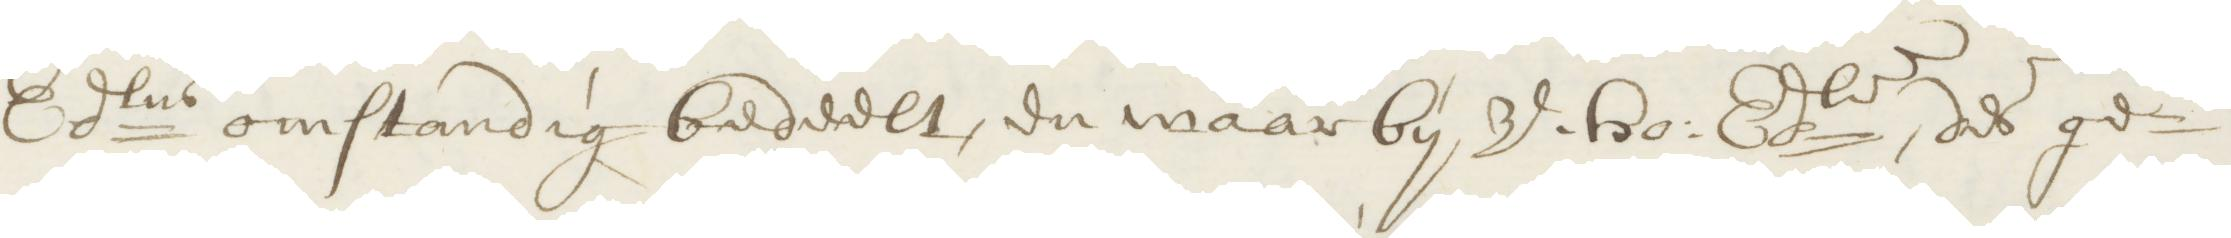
Ed:lns omstandig bedeelt, en waar bij V.ho: Ed=le, des ge=
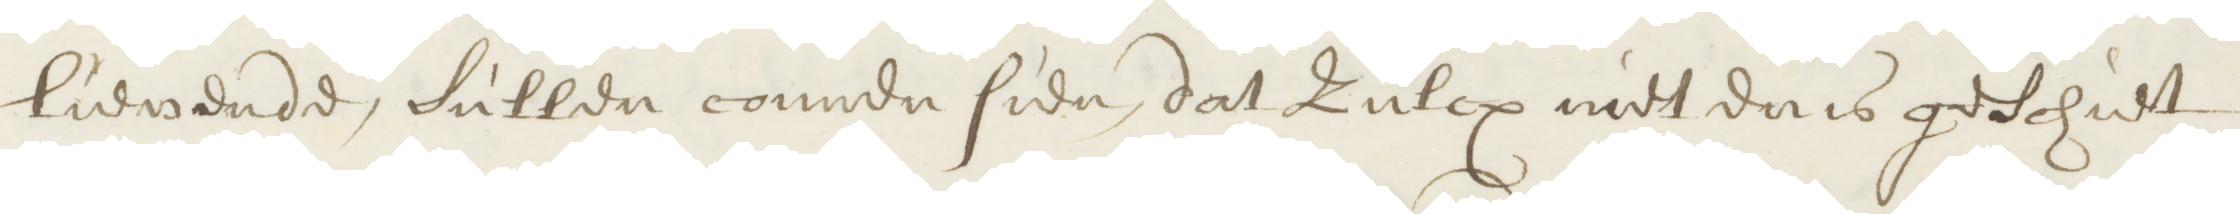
lievende, sullen connen sien, dat Zulcx niet en is geschiet
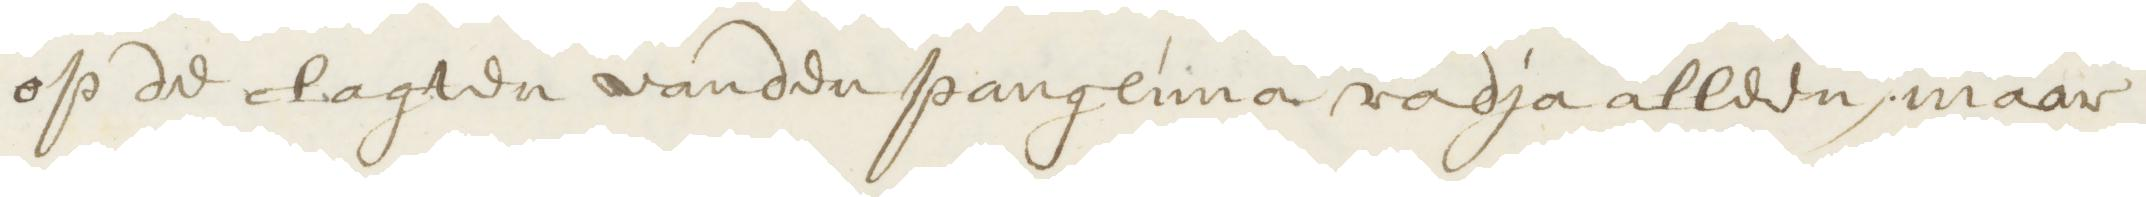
op de clagten van den panglima radja alleen, maar
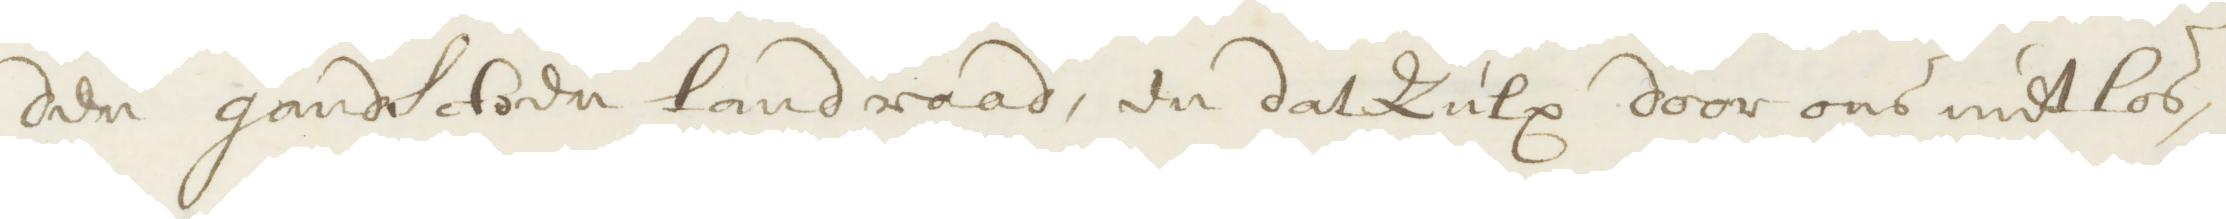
den gandschen landraad en dat Zulx door ons niet los,
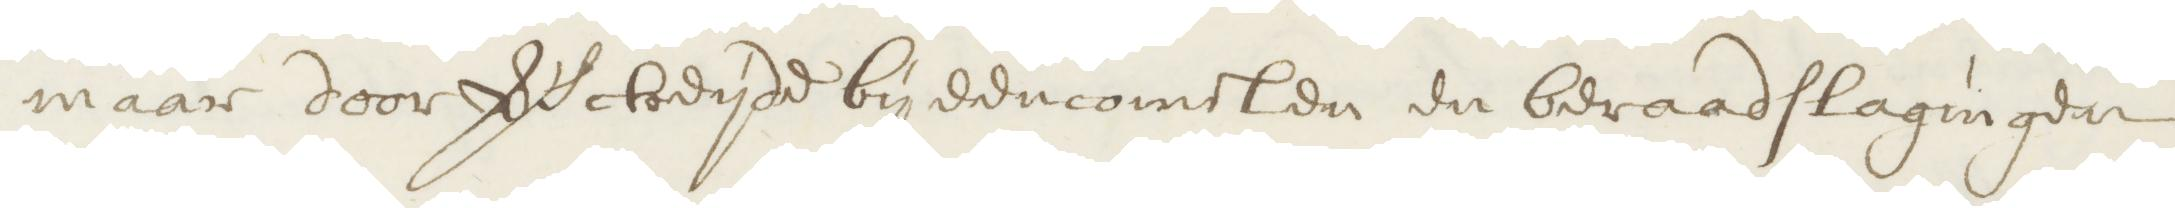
maar door verscheijde bij eencomsten en beraadslagingen
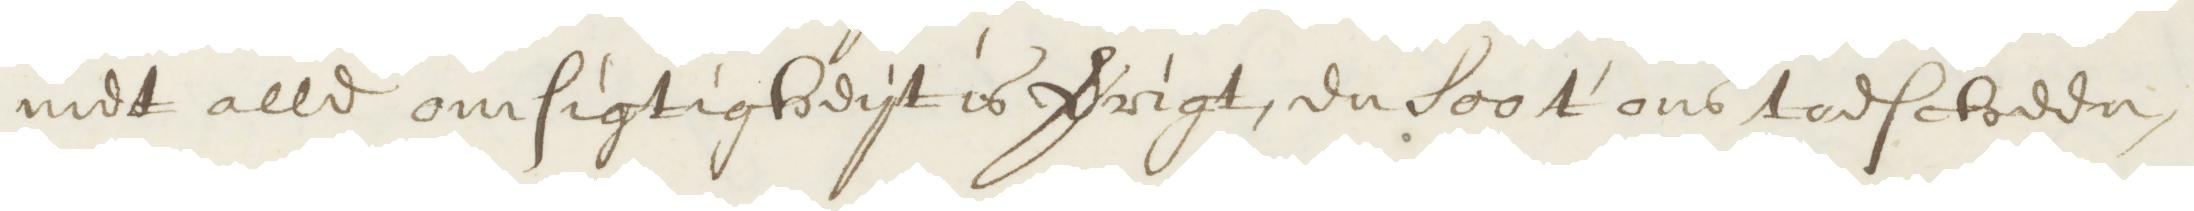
met alle omsigtigheijt is Verrigt, en Soo t' ons toescheen,
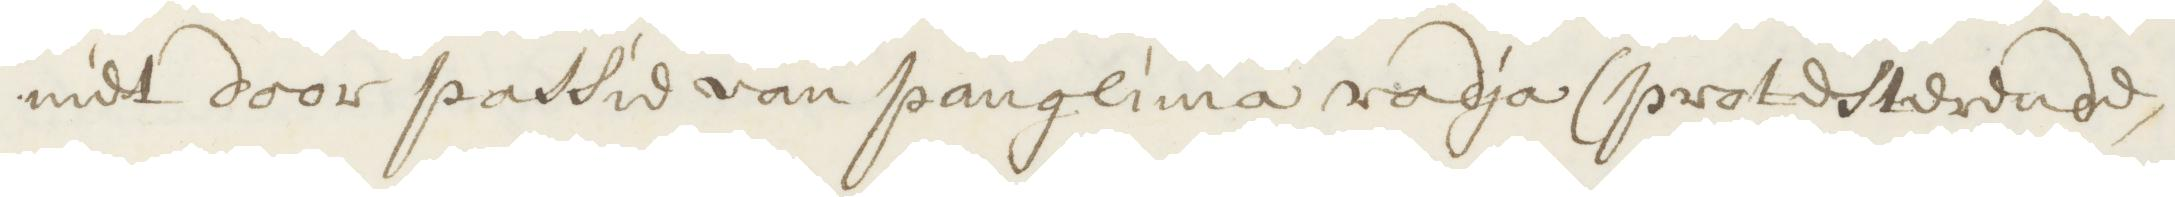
niet door passie van panglima radja (protesterende,
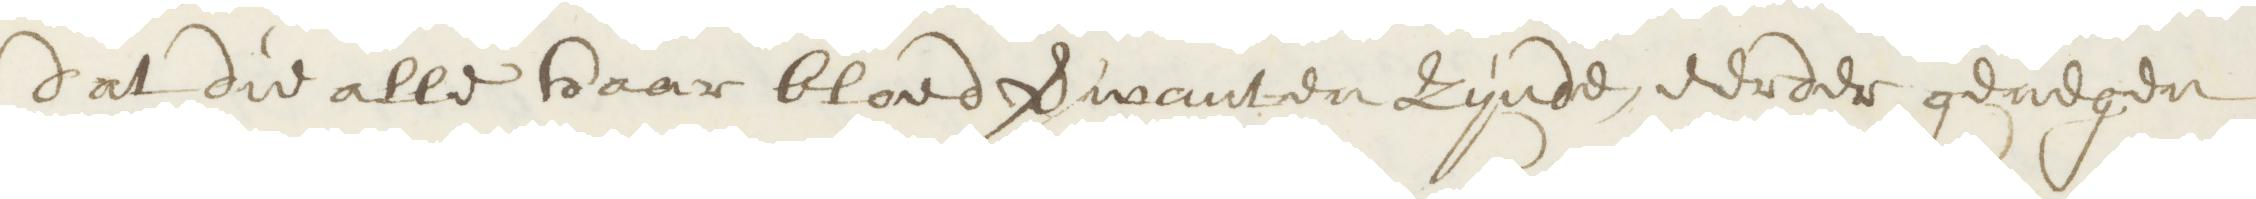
dat die alle haar bloed verwanten Zijnde, eerder genegen
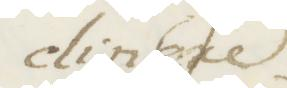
clinere
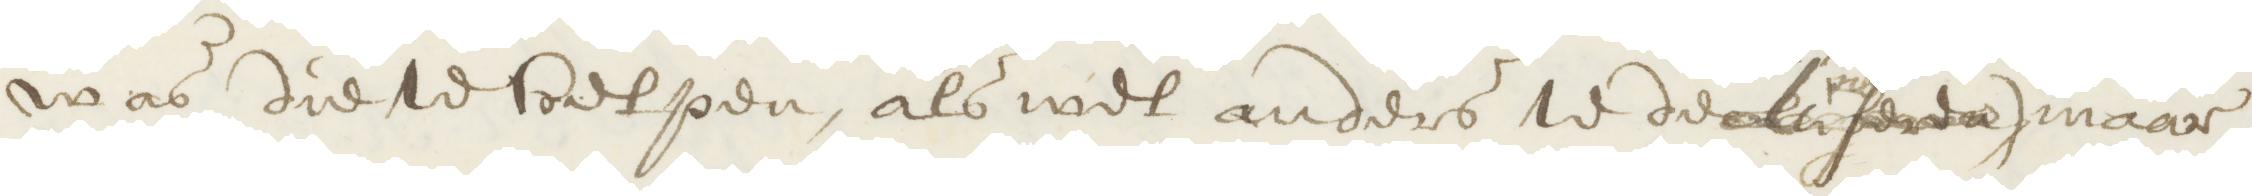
was die te helpen, als wel anders te declser) maar
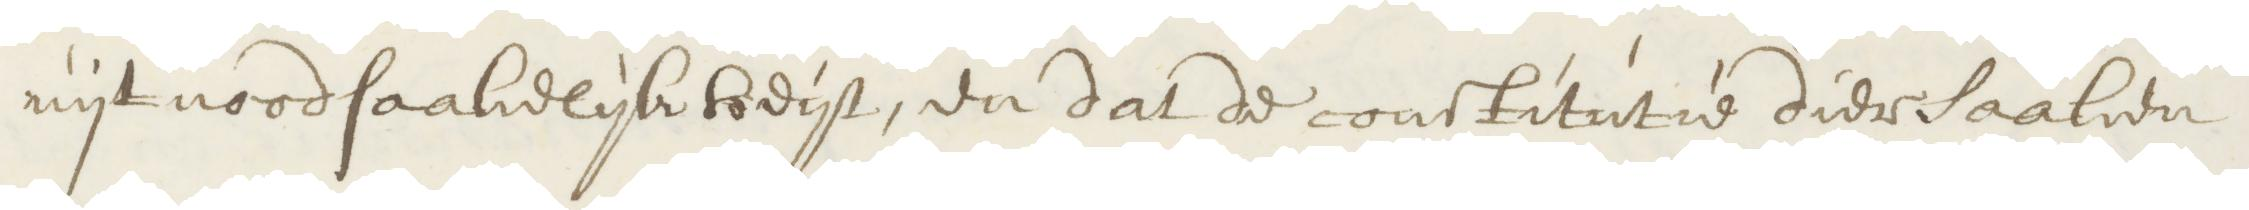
uijt noodsaakelijkheijt, en dat de constitutie dier Saaken
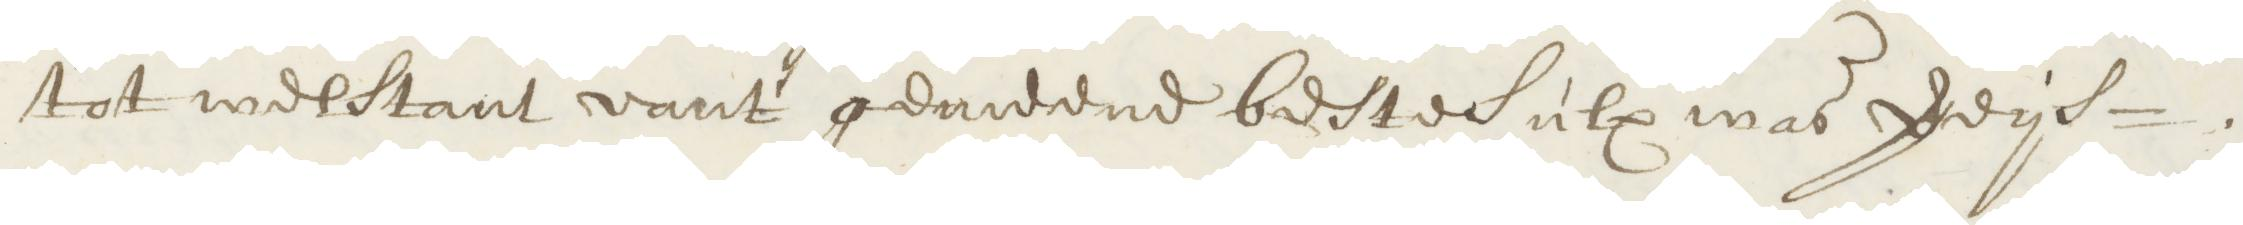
tot welstant vant' gemeene beste Sulx was vereijs=
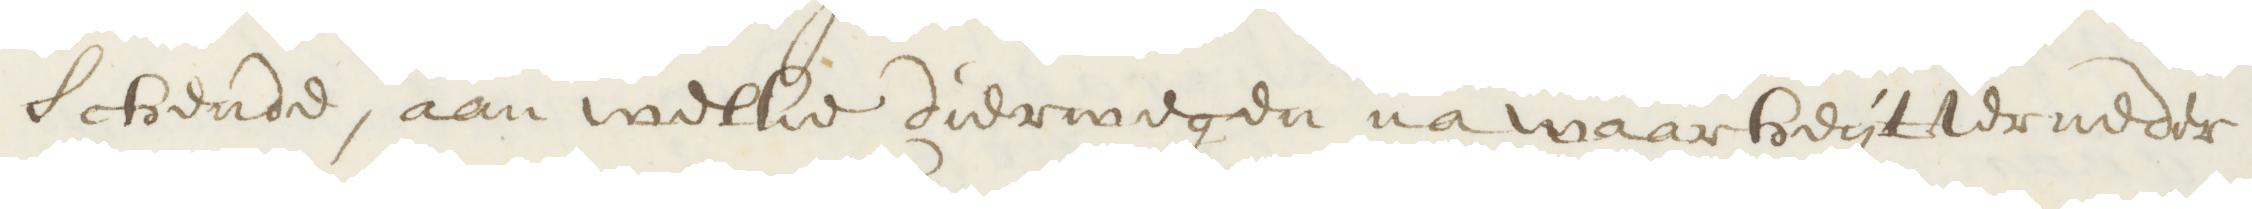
schende, aan welke dierwegen na waarheijt ter neder
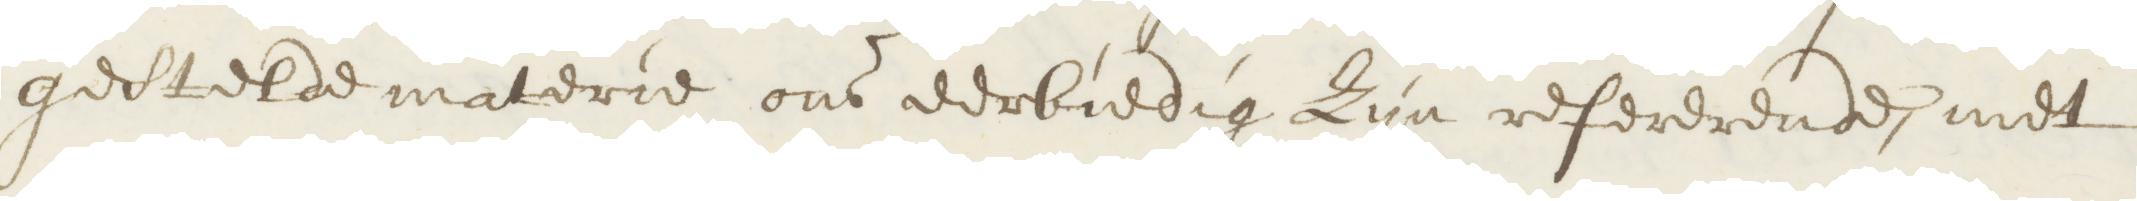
gestelde materie ons eerbiedig Zijn refererende, met
